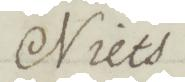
Niets
